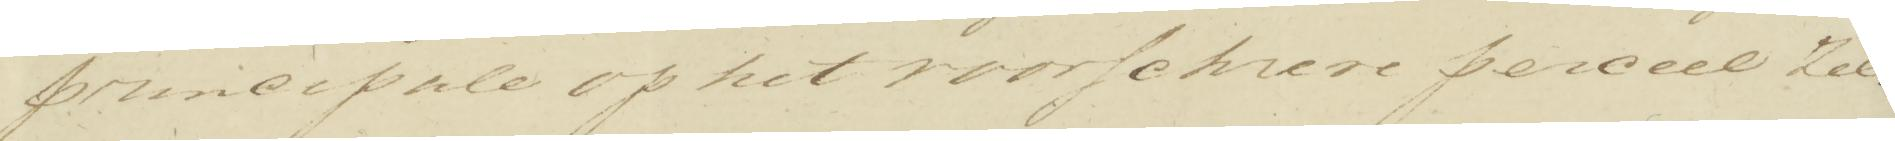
principale op het voorschreve perceel zel„
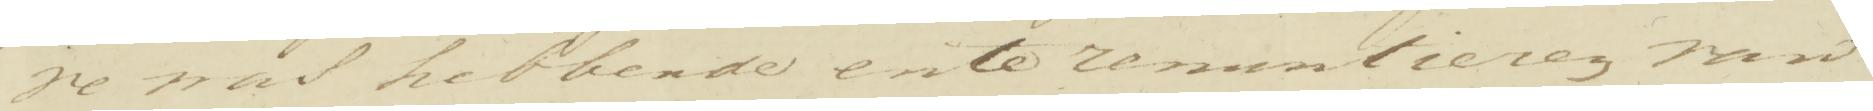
ve was hebbende en te renuntieren van
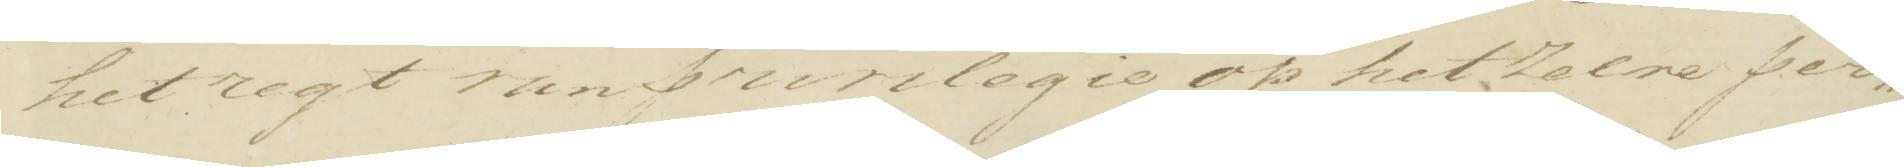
het regt van privilegie op het zelve per
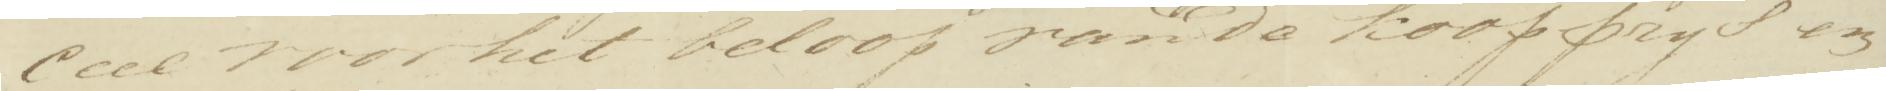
ceel voor het beloop van de koopprys en
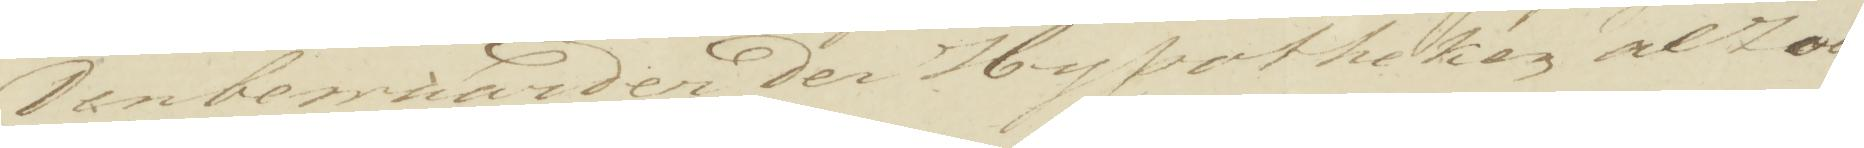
den bewaarder der Hypotheken alzoo
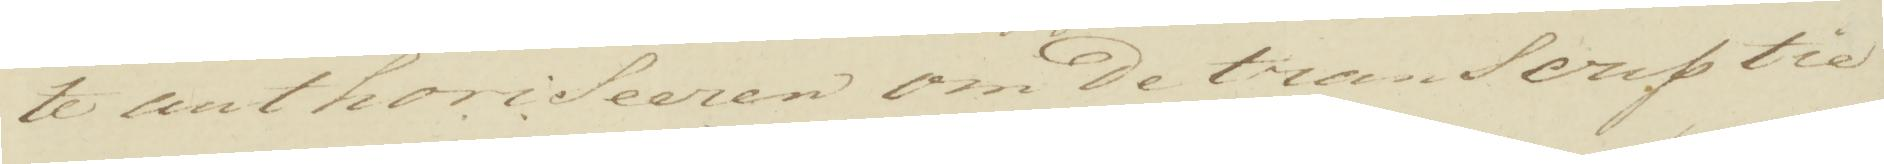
te authoriseeren om de transcriptie
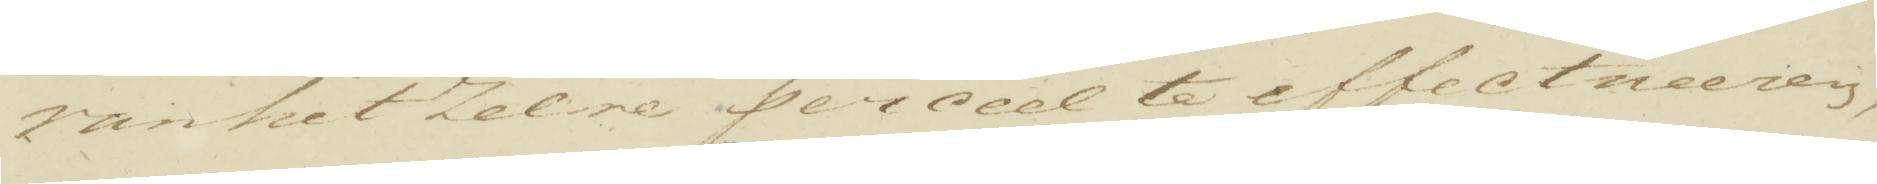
van hetzelve perceel te effectueeren,
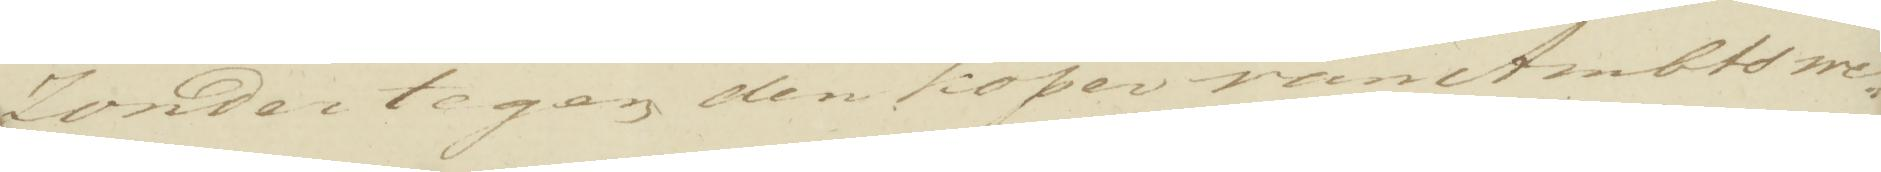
zonder tegen den koper van Ambtswe„
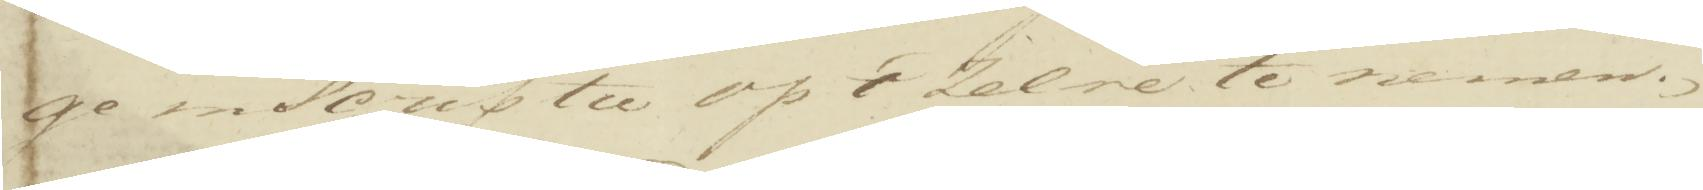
ge insriptie op ’t zelve te nemen.
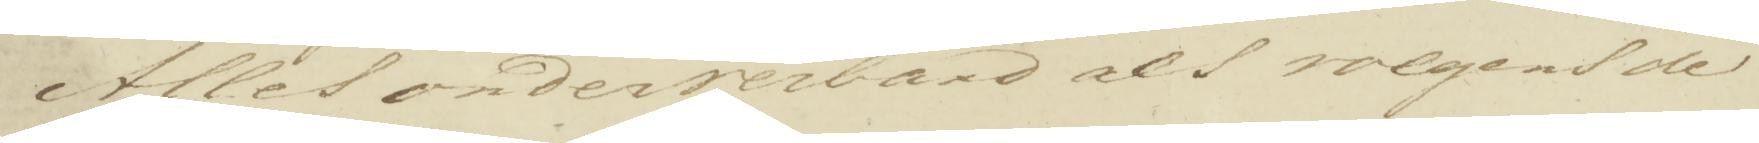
Alles onder verband als volgens de
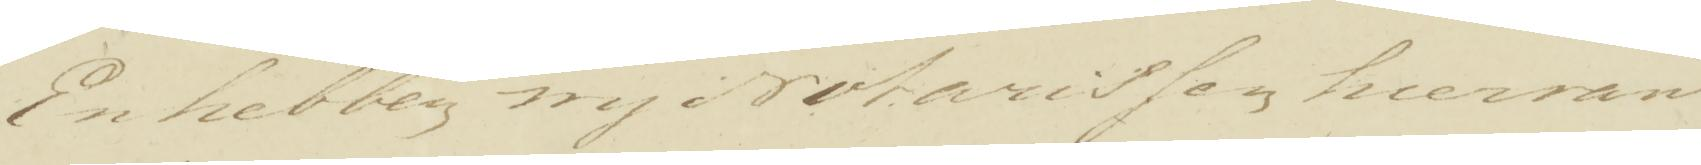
En hebben wy Notarissen hiervan
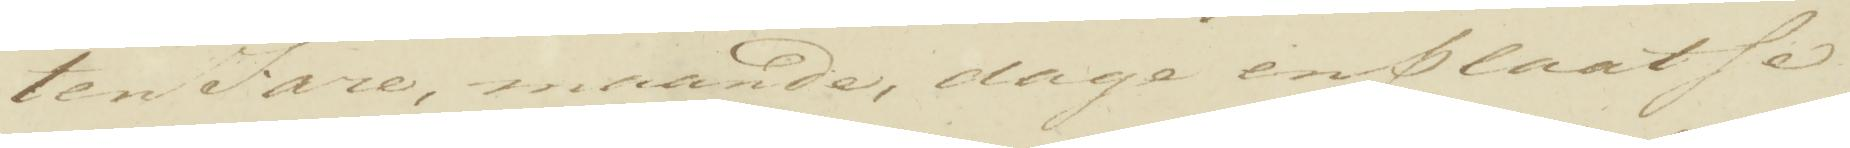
ten Jare, maande, dage en plaatse
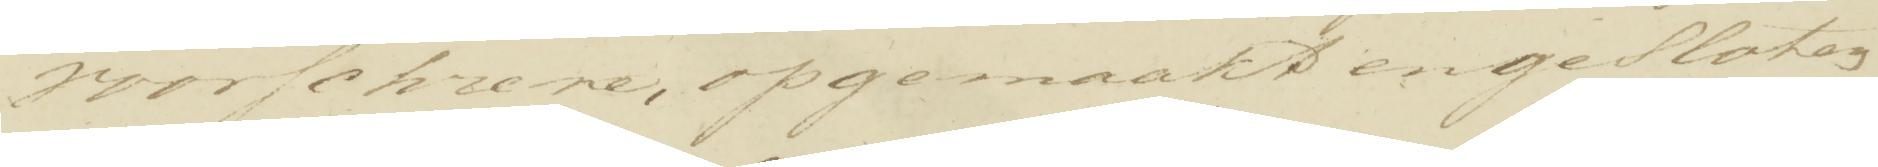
voorschreve, opgemaakt en gesloten
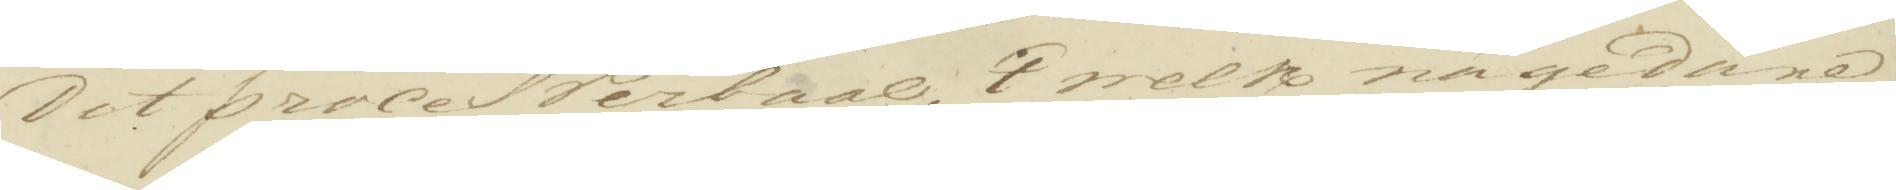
dit proces verbaal, ’t welk na gedane
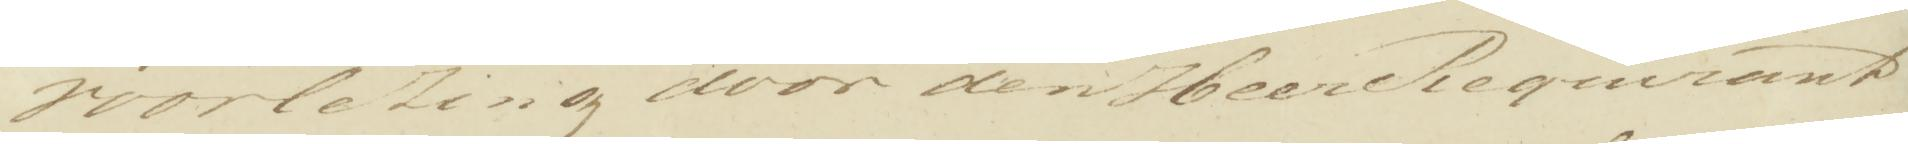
voorlezing door den Heer Requirant
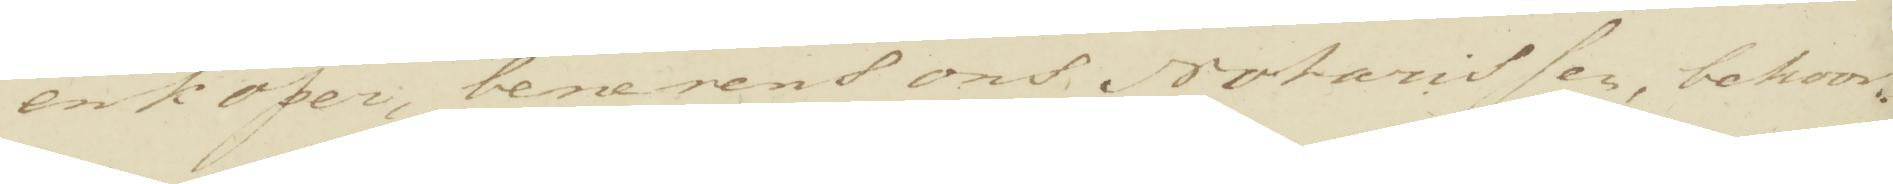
en koper, benevens ons Notarissen, behoor„
